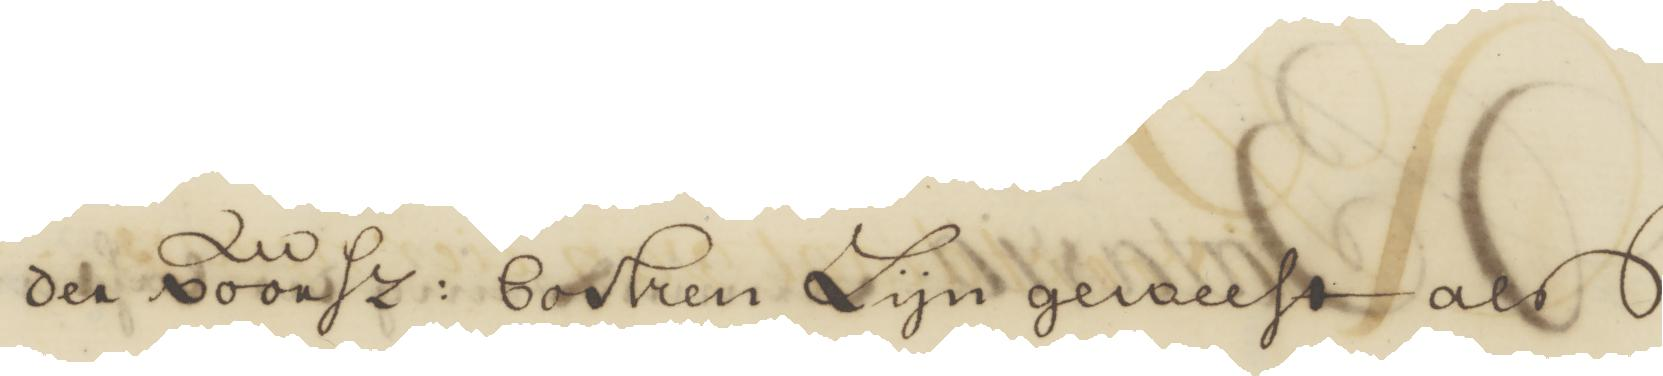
der voorsz: boeken zijn geweest als
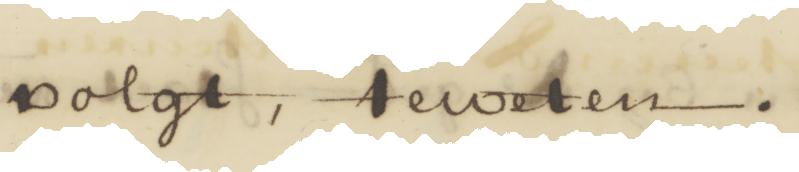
volgt, teweten.
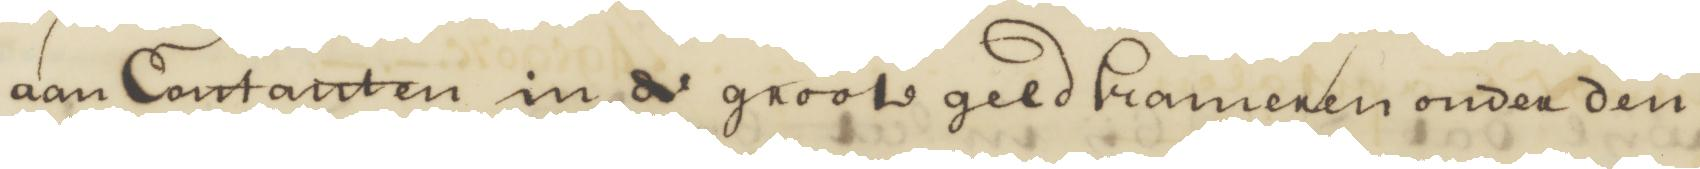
aan Contanten in de groote geldkameren onder den
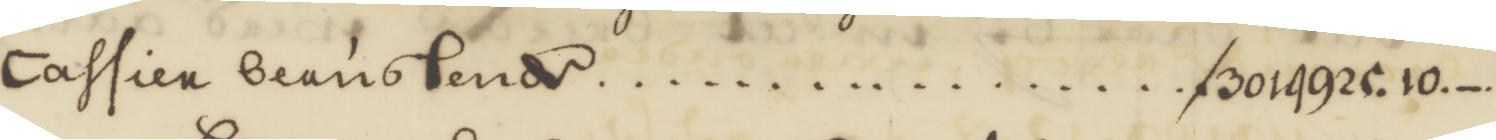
Cassier berustende. . . . . . . . . . . . . . . . . . ƒ3014925.10.-.
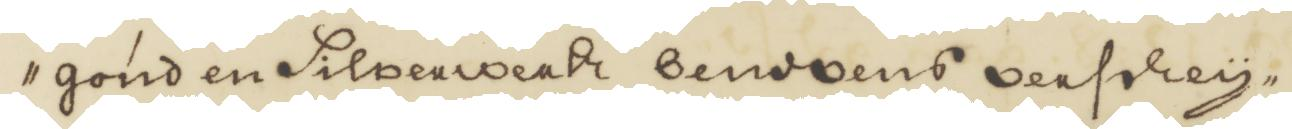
„ goud en silverwerk benevens verscheij„
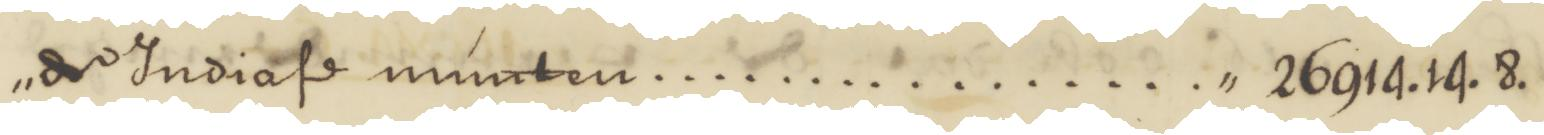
„ de Indiase munten . . . . . . . . . . . . . . . . „ 26914.14.8
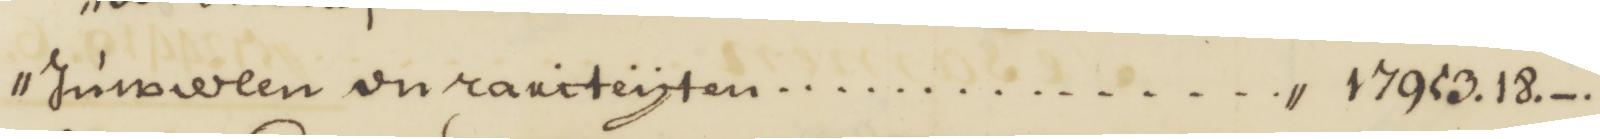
„ Juweelen en rariteijten . . . . . . . . . . . . . . . . „ 17953.18.-.
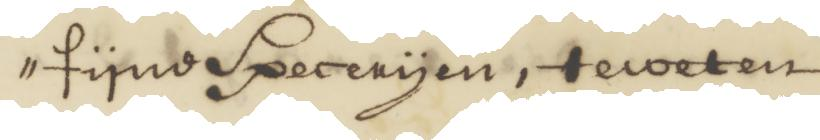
„ fijne Specerijen, teweten
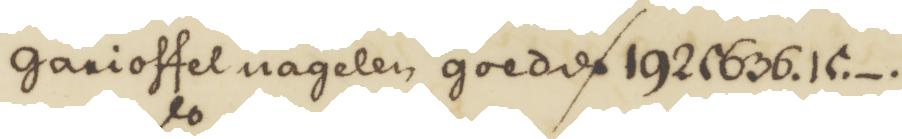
Garioffel nagelen goede ƒ1925636.15.-.
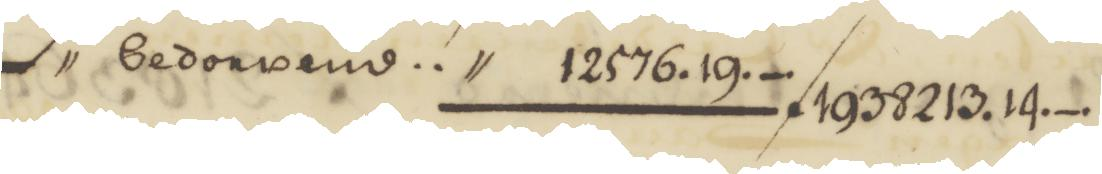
d„o bedorvene . . „ 12576.19.-. ƒ1938213.14.-.
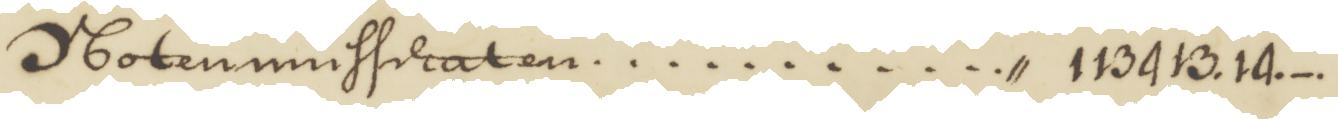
Noten mussecaten . . . . . . . . . . „ 113413.14.-.
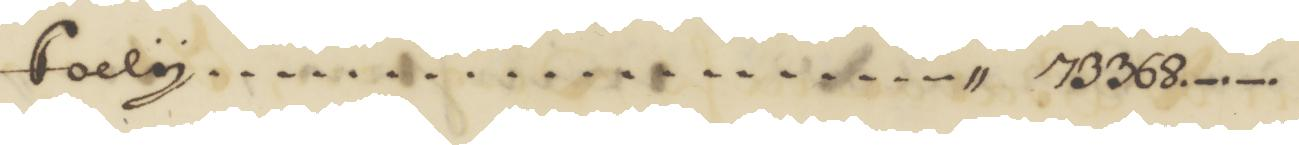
foelij . . . . . . . . . . . . . . . . . . . . . „ 73368.-.-.
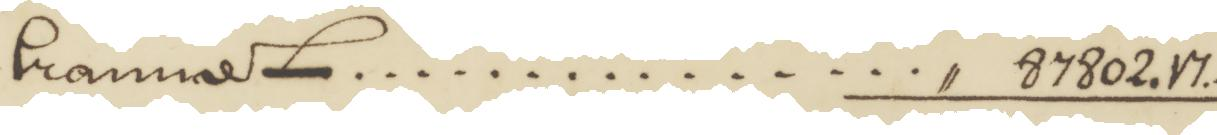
kanneel . . . . . . . . . . . . . . . . . „ 87802.17
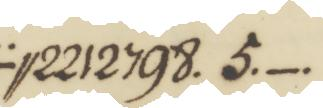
„ 2212798. 5.-.
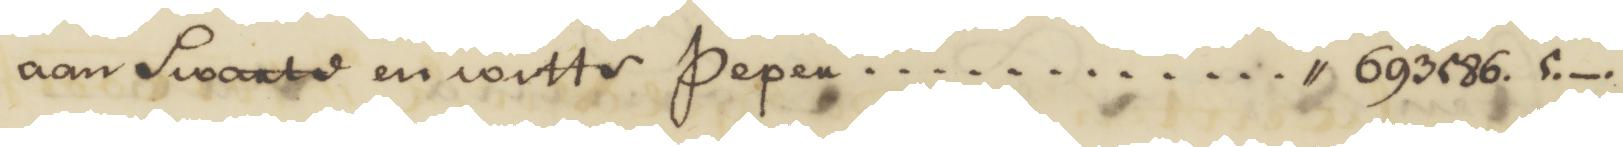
aan swarte en witte Peper . . . . . . . . . . . . . . „693586. 5.-.
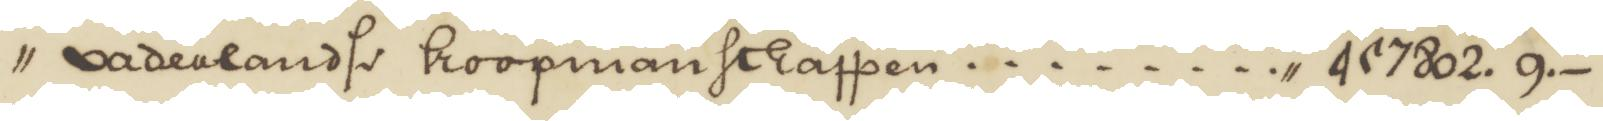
„ vaderlandse koopmanschappen . . . . . . . „ 457802.9.-
